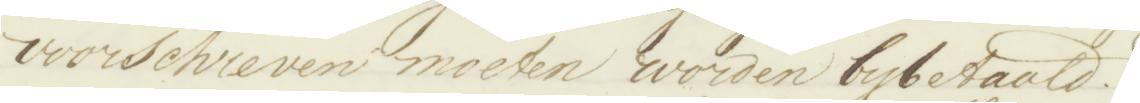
voorschreven moeten worden bybetaald.
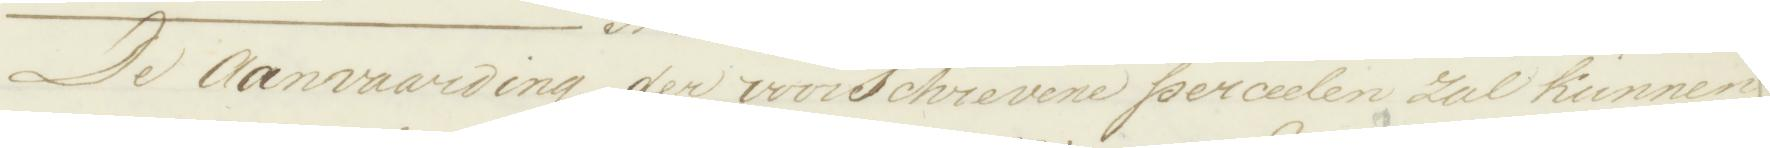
De aanvaarding der voorschrevene perceelen zal kunnen
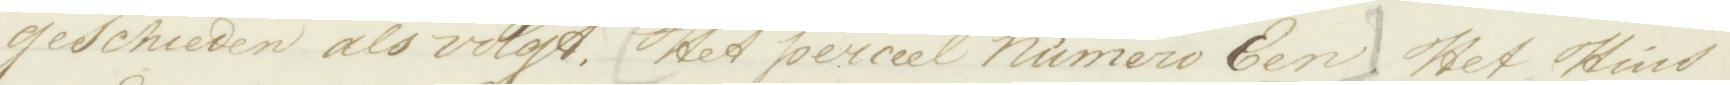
geschieden als volgt, (Het perceel Numero Een) Het Huis
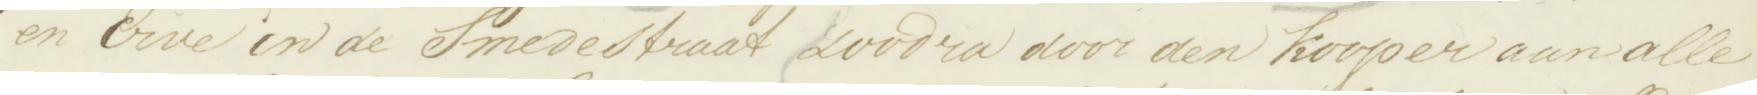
en Erve in de Smedestraat (zoodra door den kooper aan alle
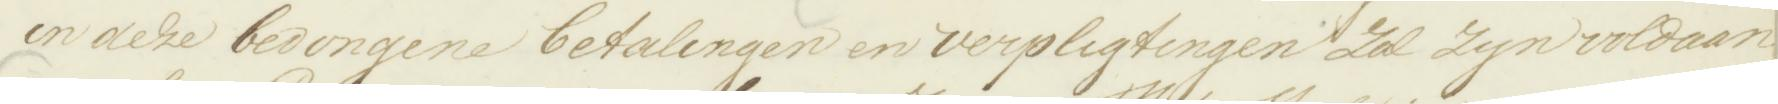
in deze bedongene betalingen en verpligtingen zal zyn voldaan
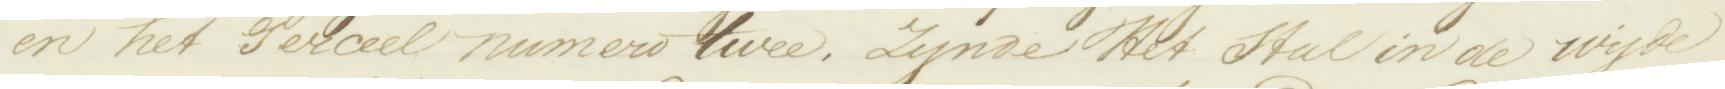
en het Perceel numero twee, zynde Het stal in de wijde
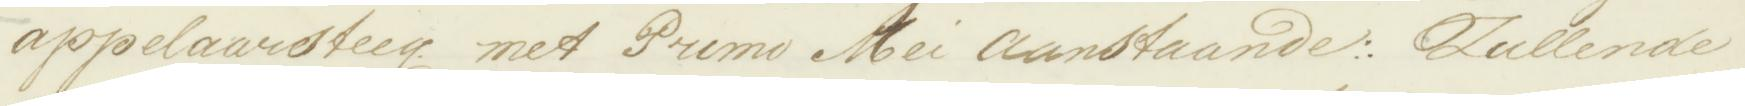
appelaarsteeg met Primo Mei Aanstaande: Zullende
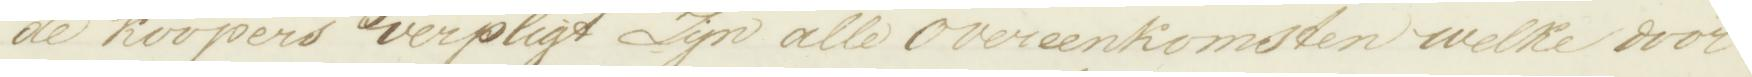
de koopers verpligt zijn alle overeenkomsten welke door
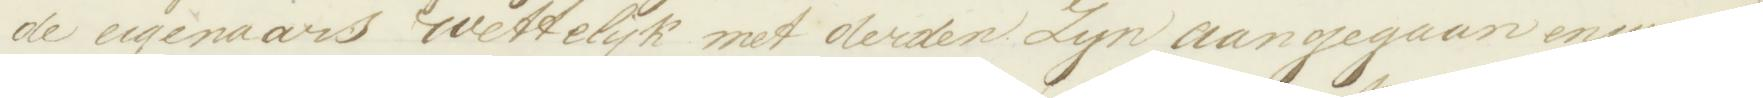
de eigenaars wettelijk met derden zyn aangegaan en waar
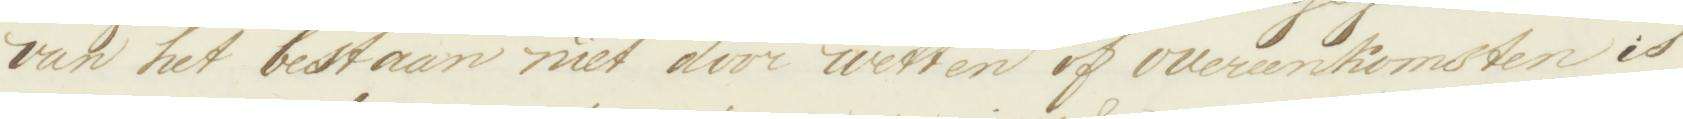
van het bestaan niet door wetten of overeenkomsten is
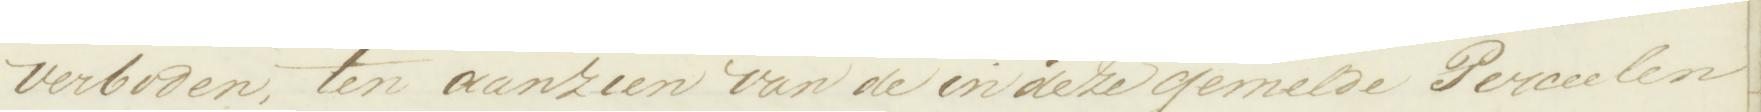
verboden, ten aanzien van de in deze gemelde Perceelen
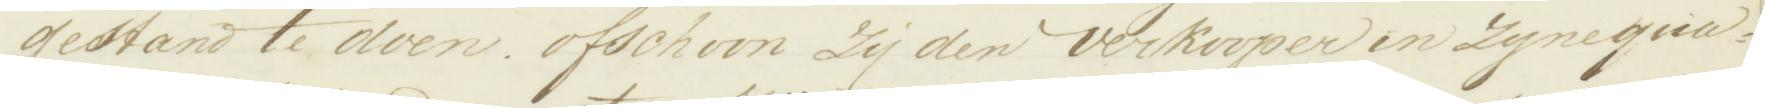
gestand te doen, ofschoon zij den verkooper in zyne qua=
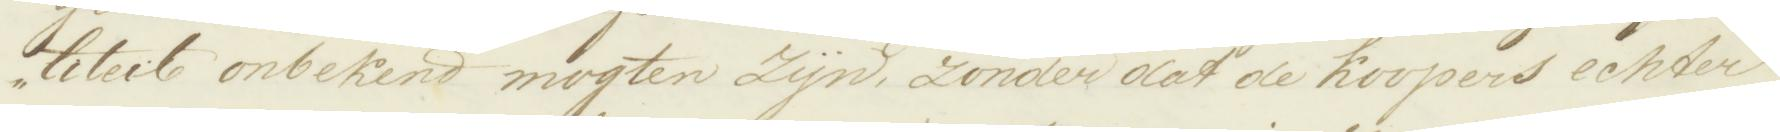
„liteit onbekend mogten zijn, zonder dat de koopers echter
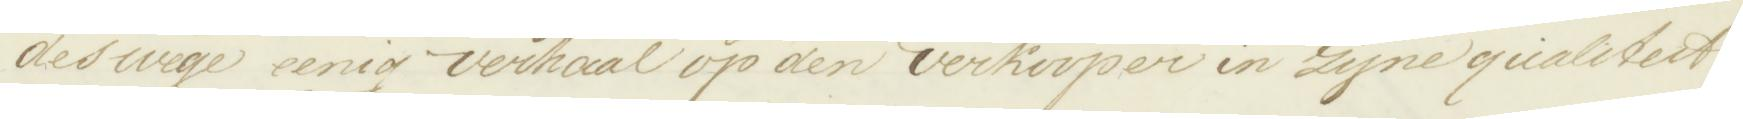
deswege eenig verhaal op den verkooper in zyne qualiteit
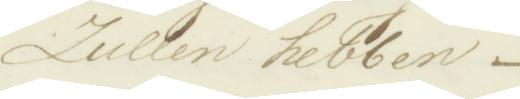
zullen hebben —
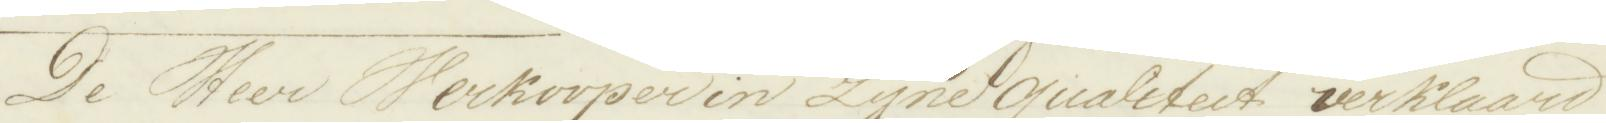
De Heer Verkooper in zijne quaiteit verklaard
